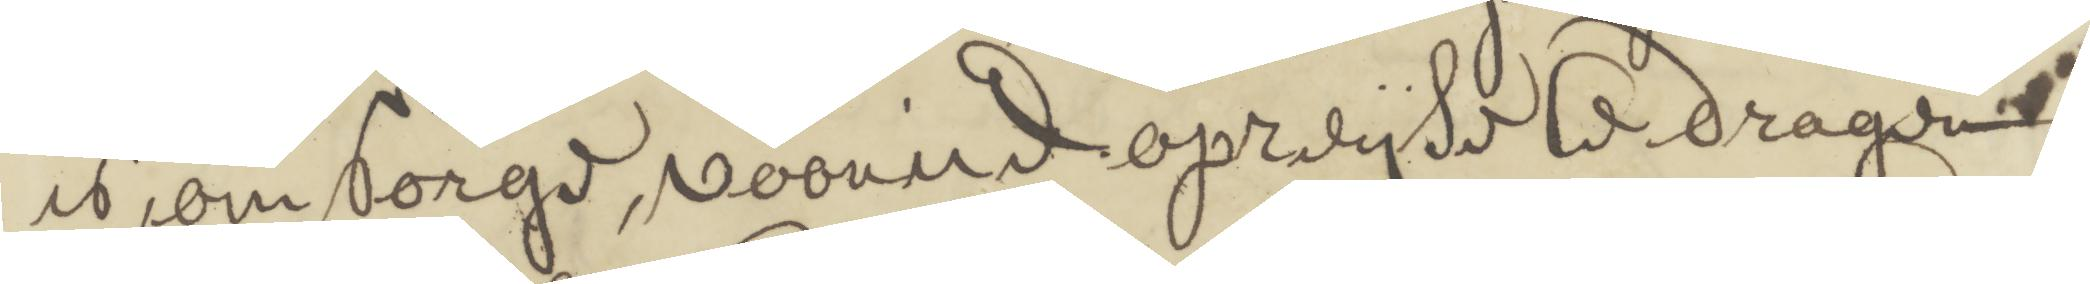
is, om sorge, voor uE: opreijse te dragen
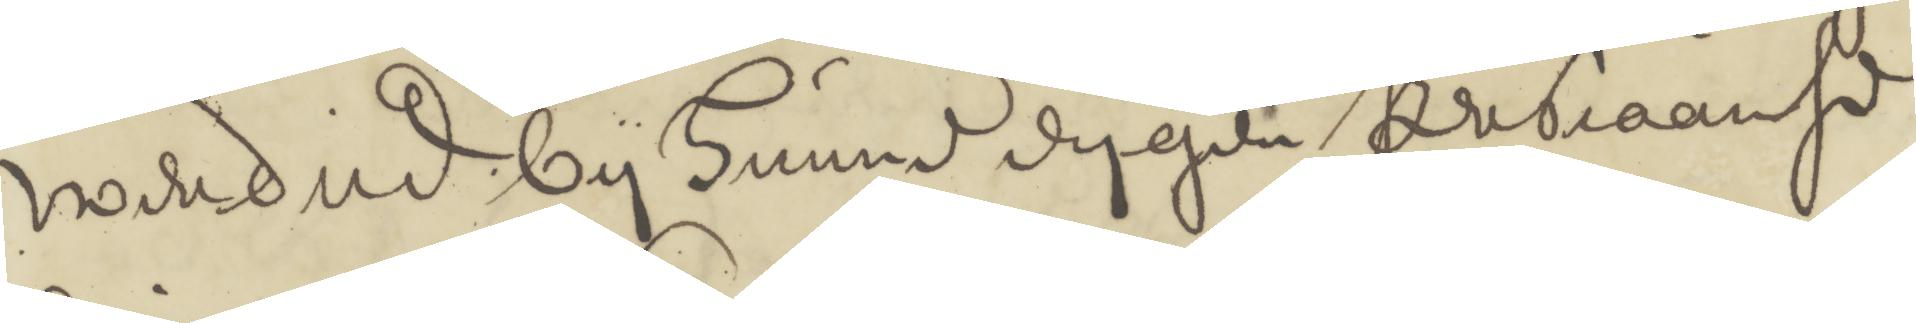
werd uE bij hunne eijgen persiaanse
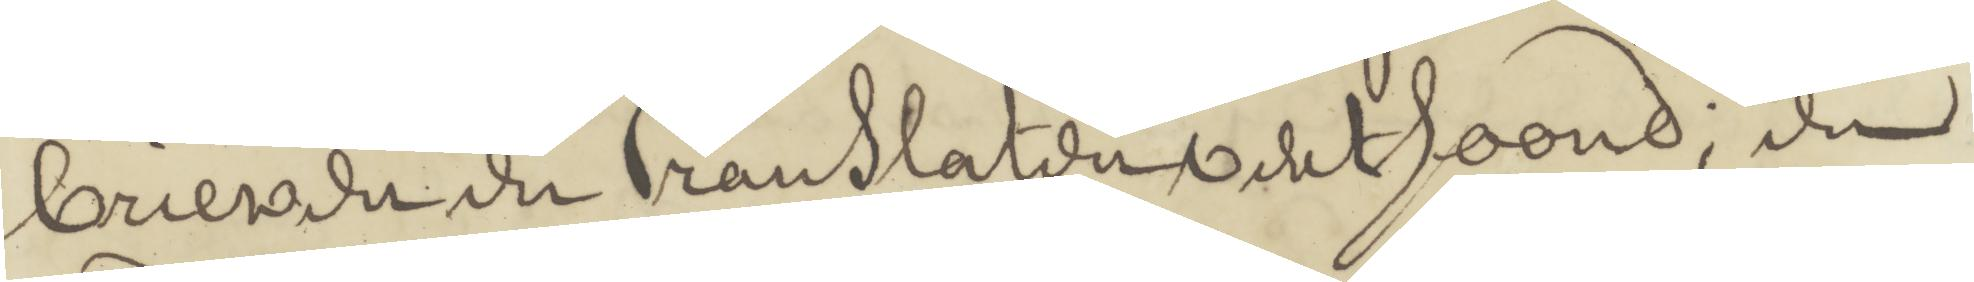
brieven en translaten verthoond; en
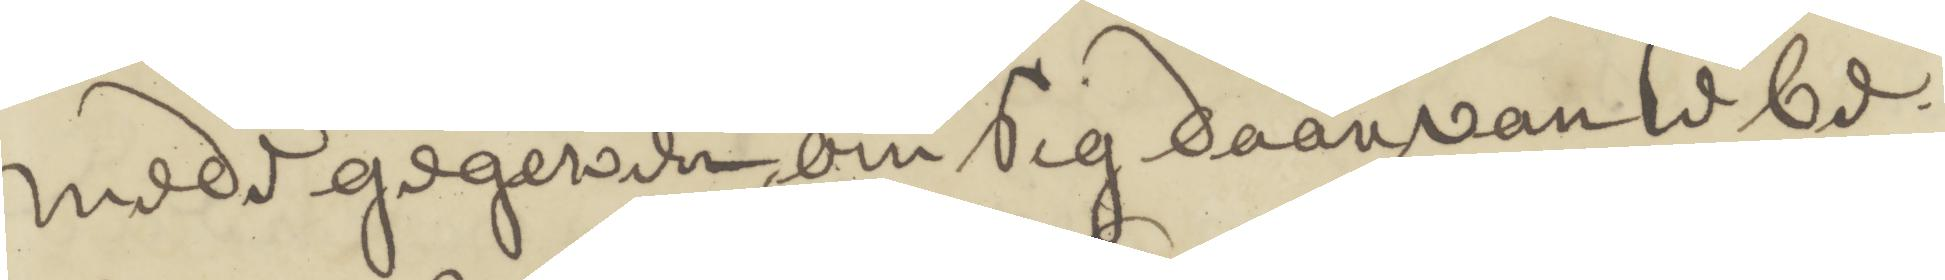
mede gegeven, om sig daar van te be-
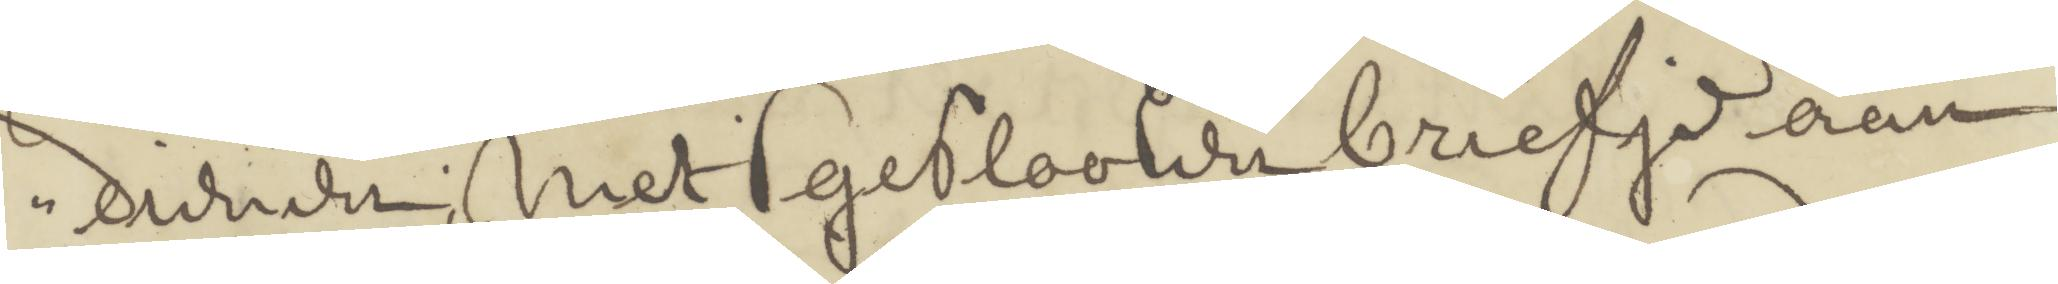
„dienen; met 't geslooten briefje aan
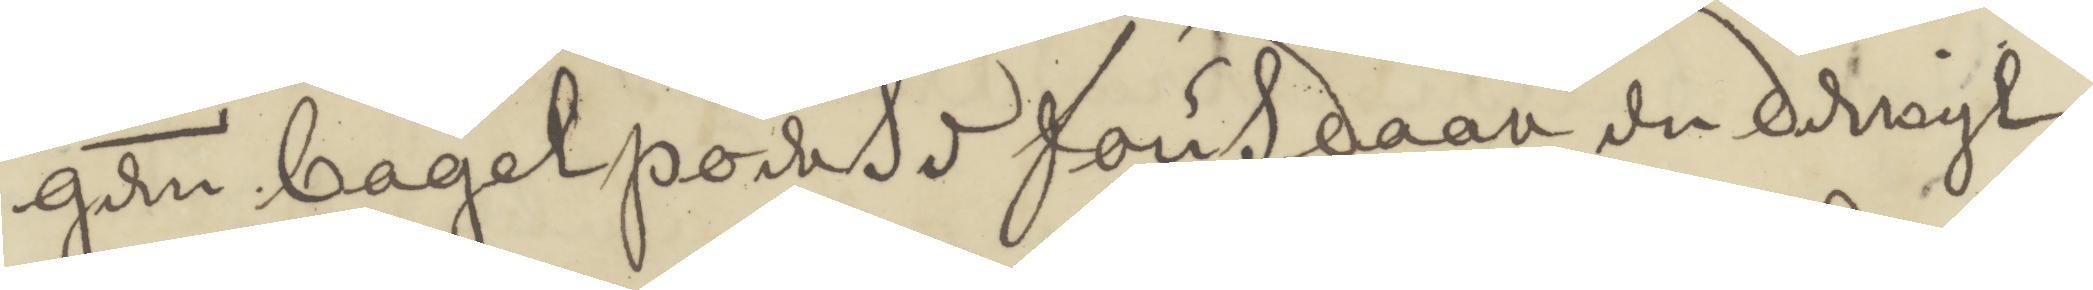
gem: bagel poerse fous daar, en dewijl
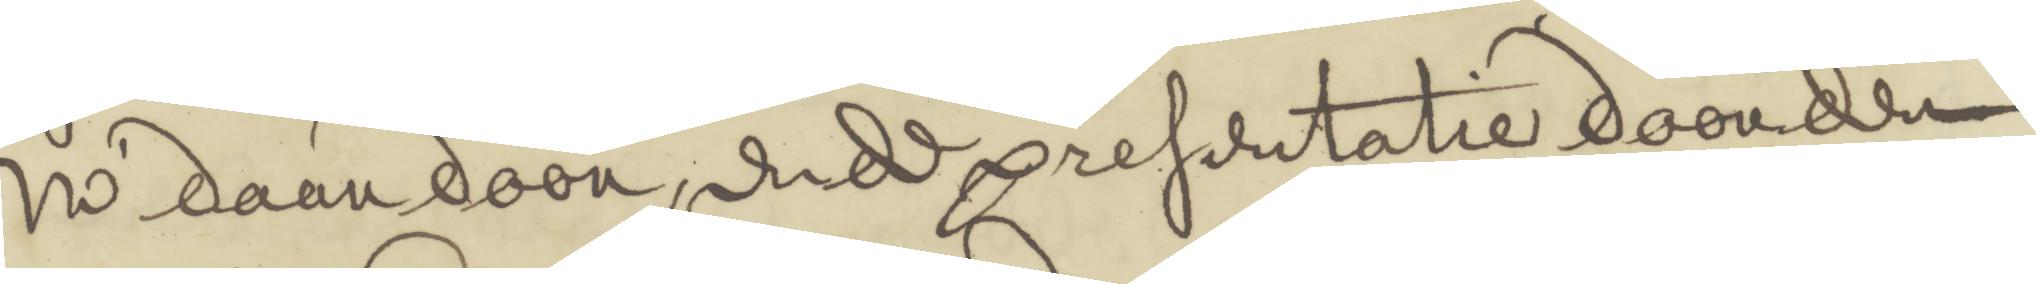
w' daar door, en de presentatie, door den
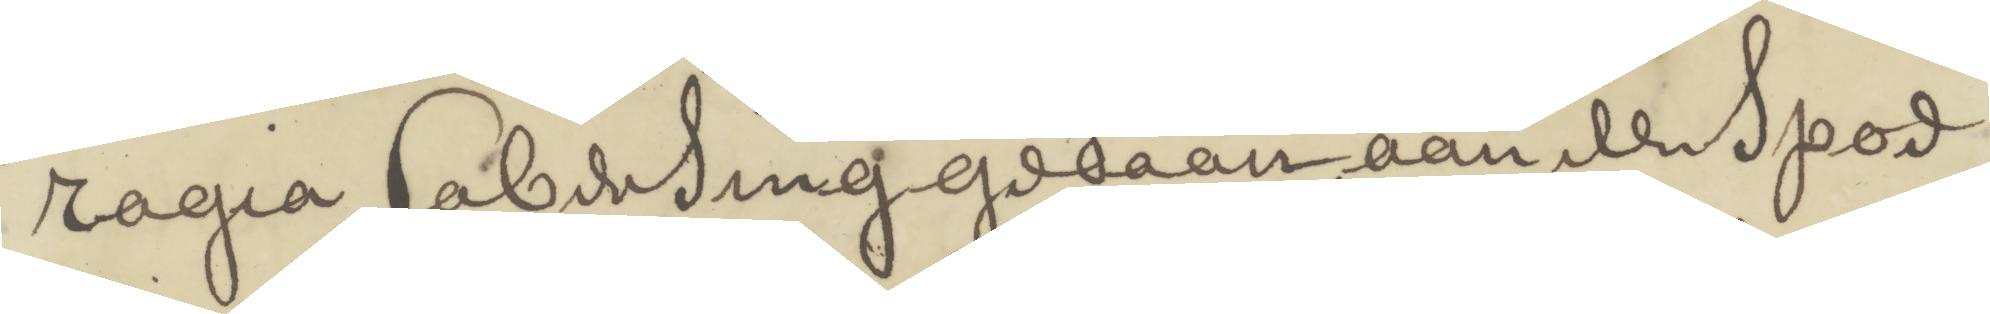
ragia tabersing gedaan, aan een spoe.
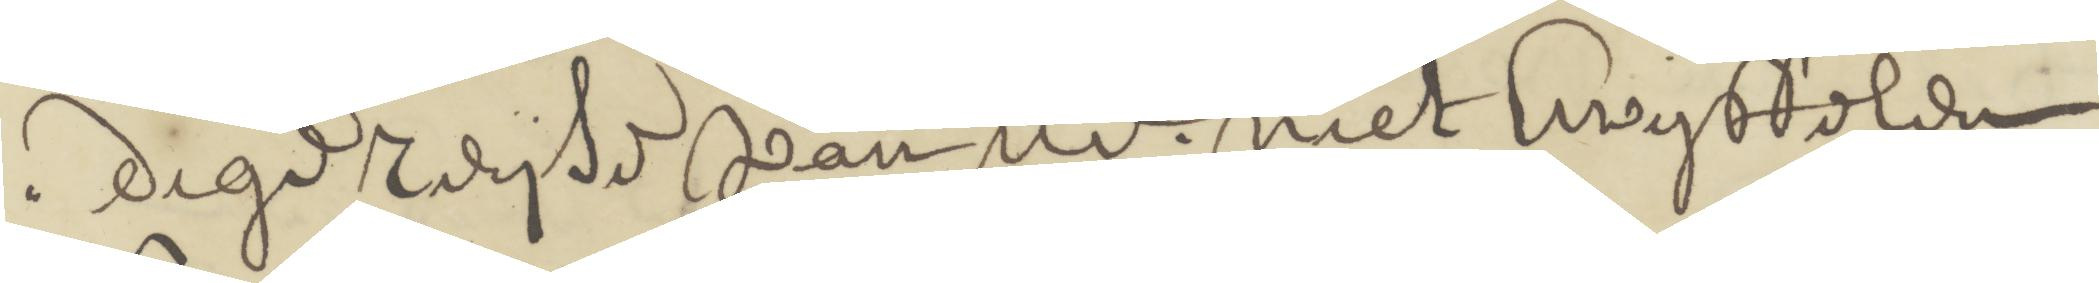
„dige reijse van uE. niet twijffelen
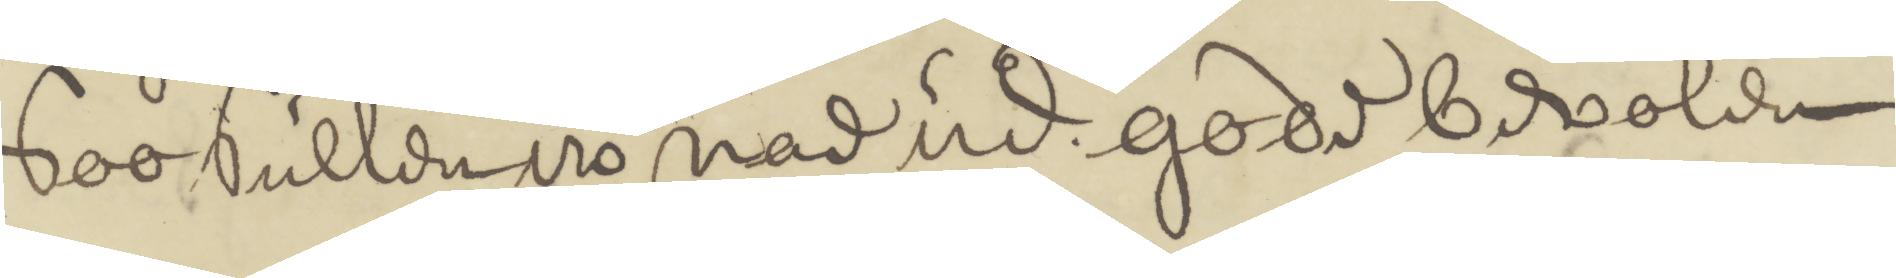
soo sullen w' nae uE. gode bevolen
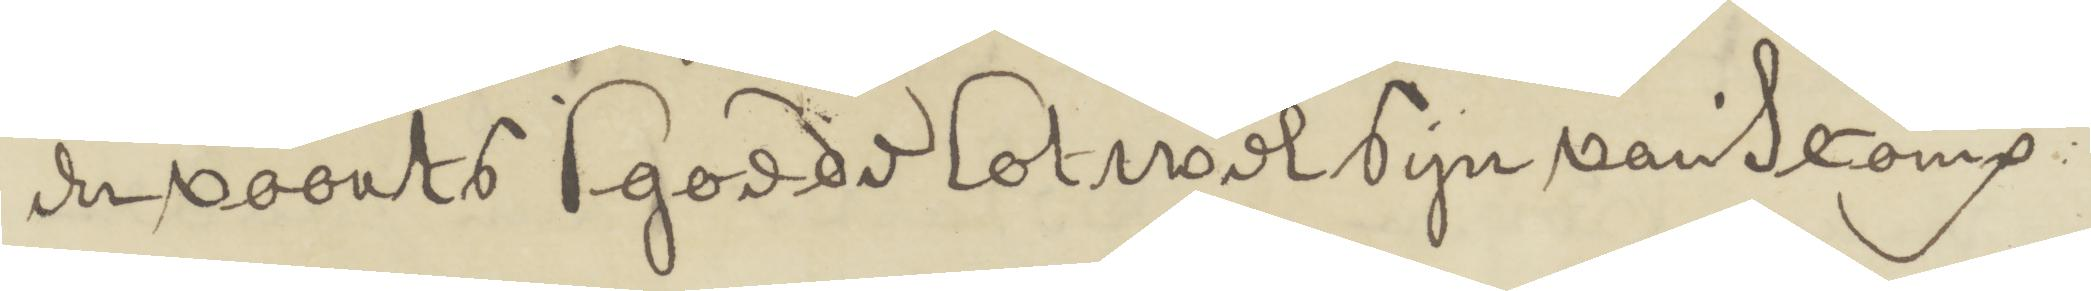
en voorts 't goede tot wel sijn van ’s comp:s
